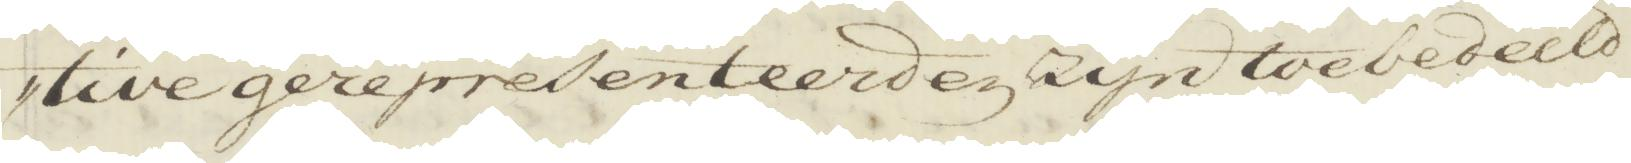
„tive gerepresenteerden zijn toebedeeld
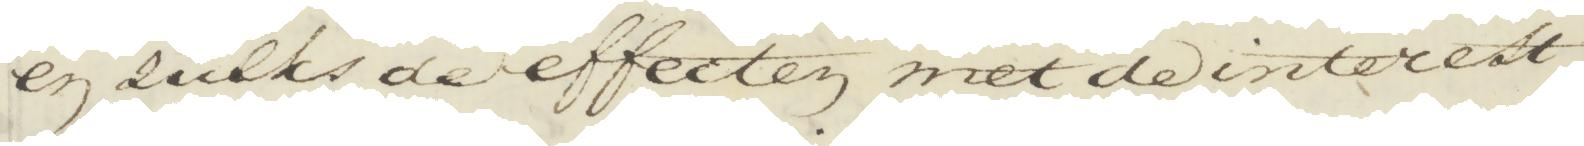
en zulks de effecten met de interest
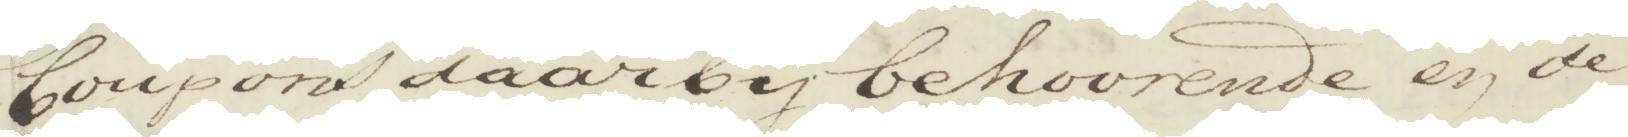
Coupons daarbij behoorende en de
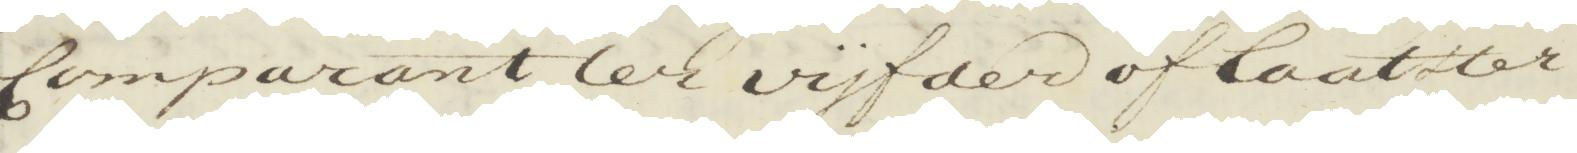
Comparant ter vijfder of laatster
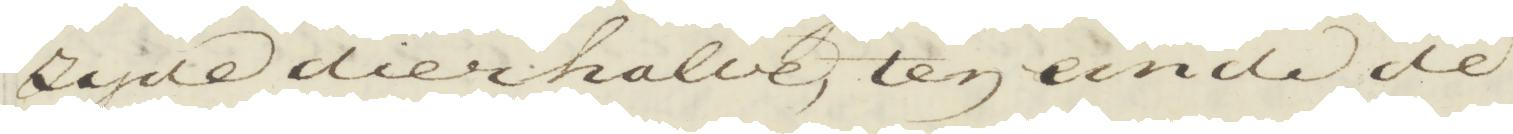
zyde dierhalve, ten einde de
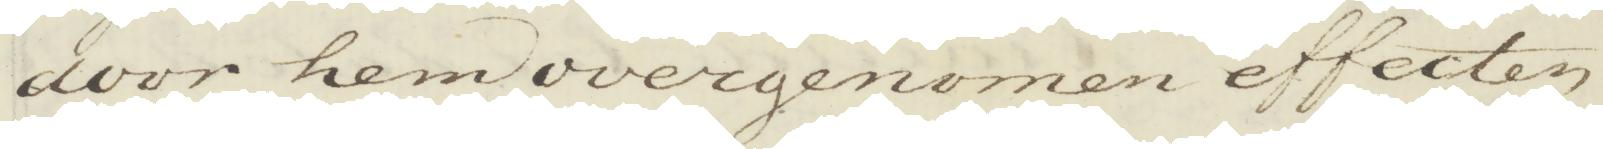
door hem overgenomen effecten
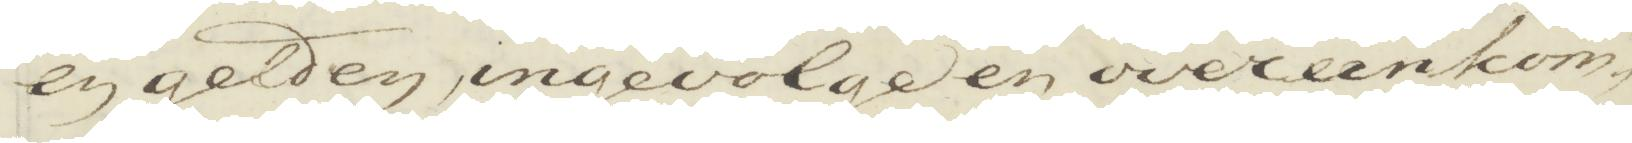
en gelden, ingevolge en overeenkom
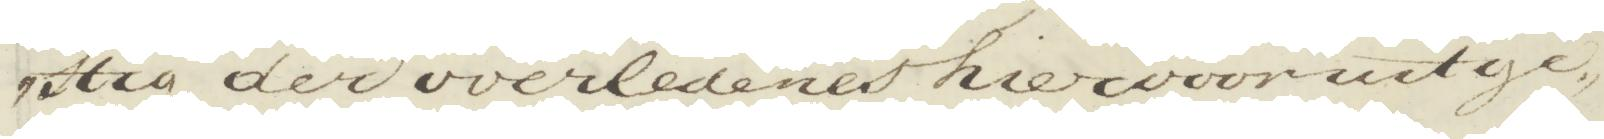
„stig der overledenes hiervoor uitge„
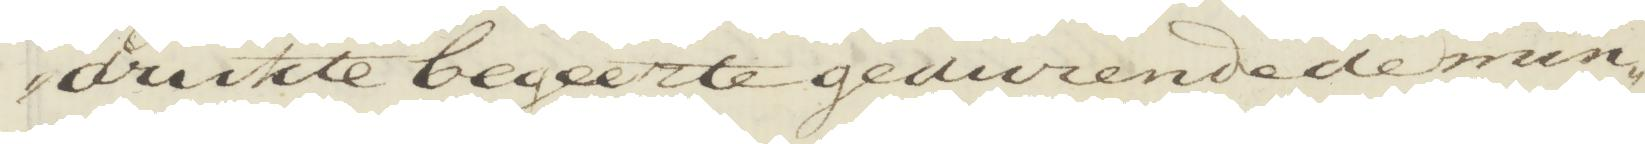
„drukte begeerte gedurende de min
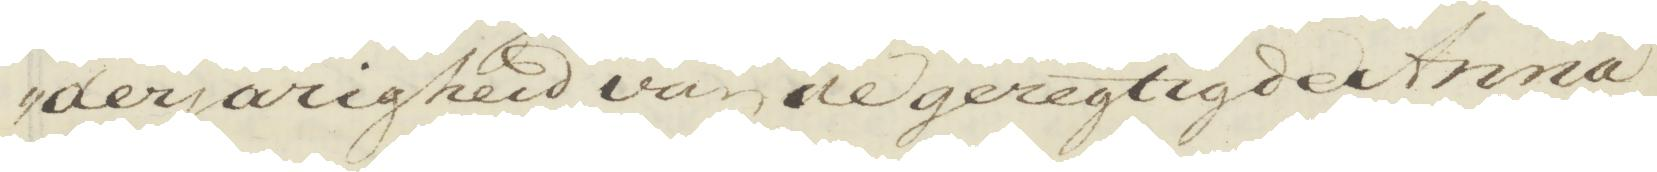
derjarigheid van de geregtigde Anna
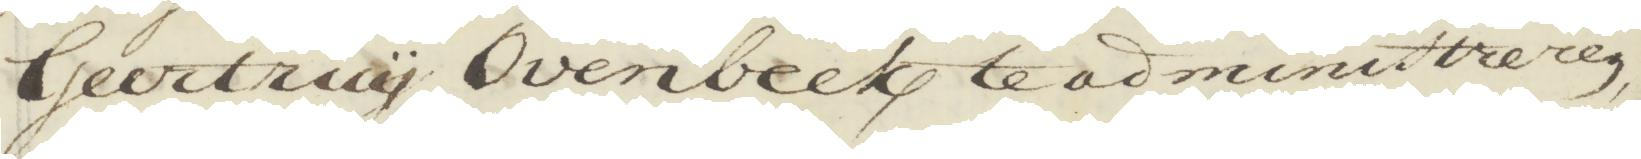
Geertruij Ovenbeek te administreren,
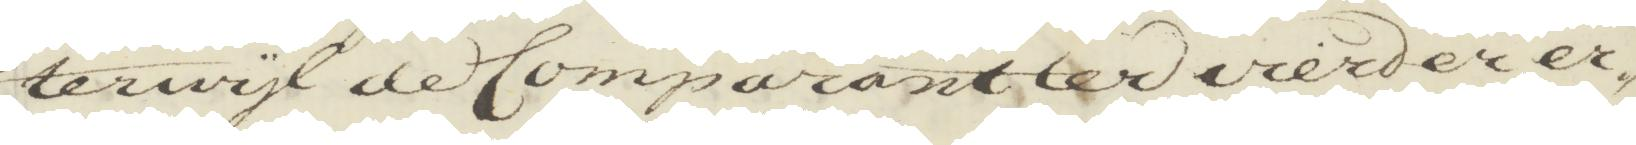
terwijl de Comparant ter vierder er
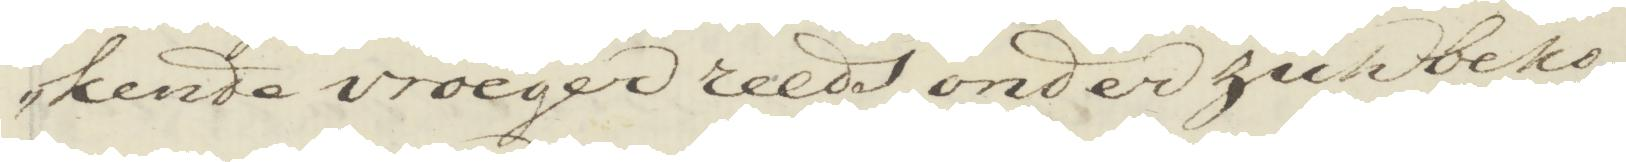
„kende vroeger reeds onder zich beko
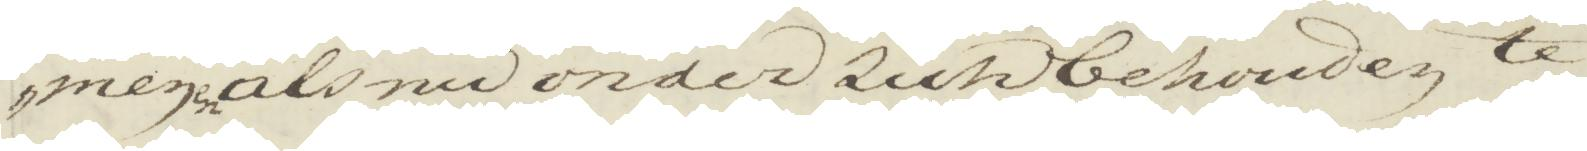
„men en als nu onder zich behouden te
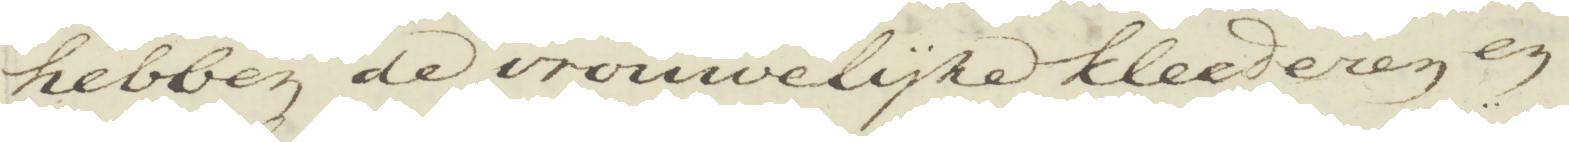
hebben de vrouwelijke kleederen en
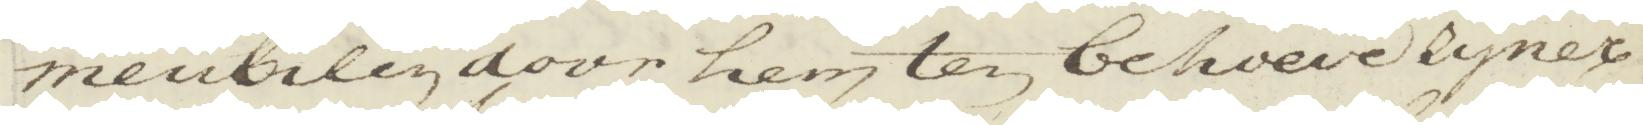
meubilen door hem ten behoeve zijner
